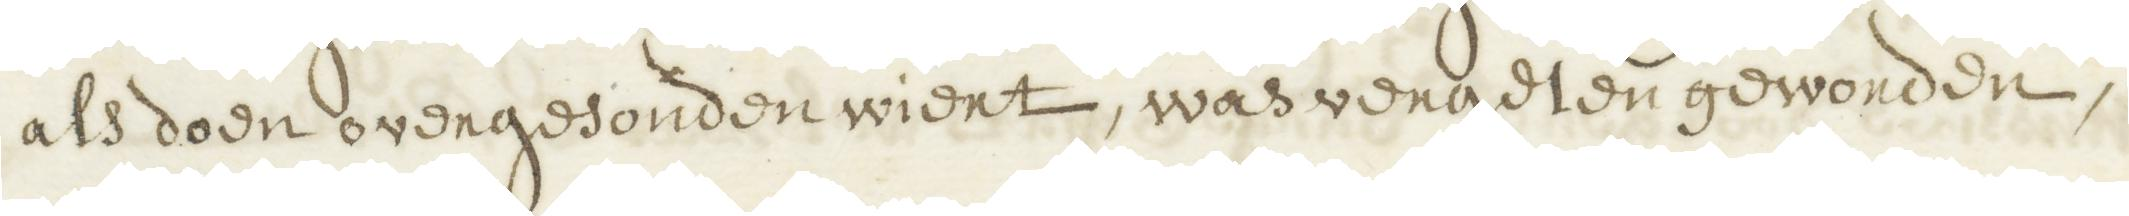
als doen overgesonden wiert, was vergeten geworden,
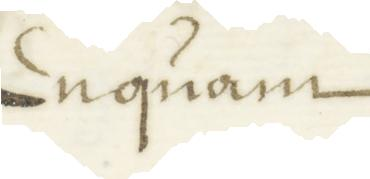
Enquam
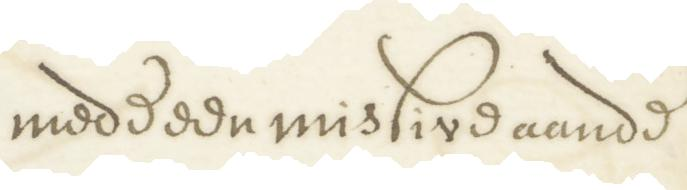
mede een missive aande
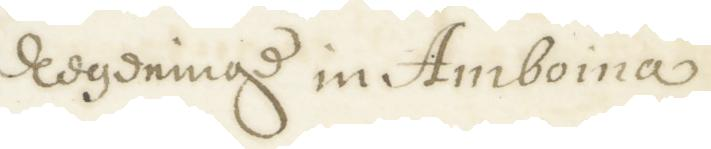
regeringe in Amboina
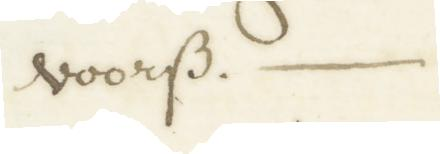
voorsz. —
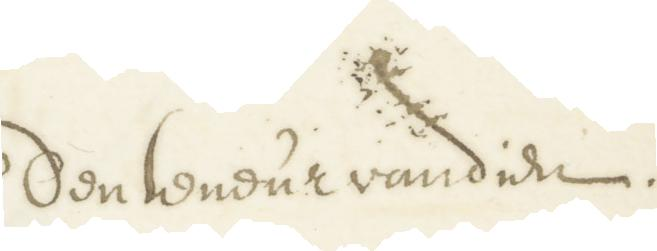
den teneur van dien.
